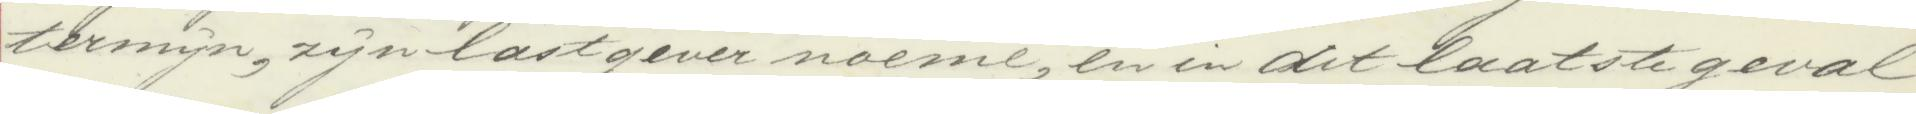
termijn, zijn lastgever noeme, en in dit laatste geval
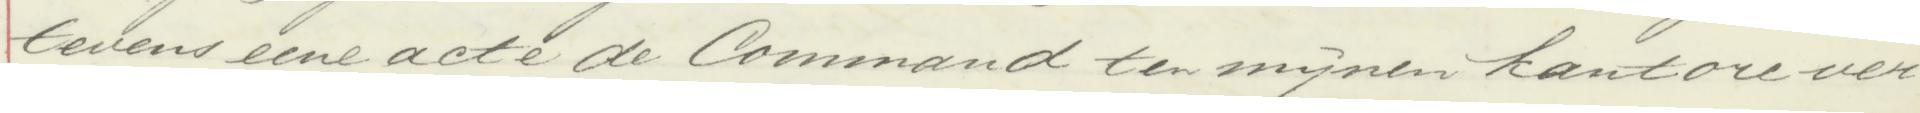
tevens eene acte de Command ter mijnen kantore ver
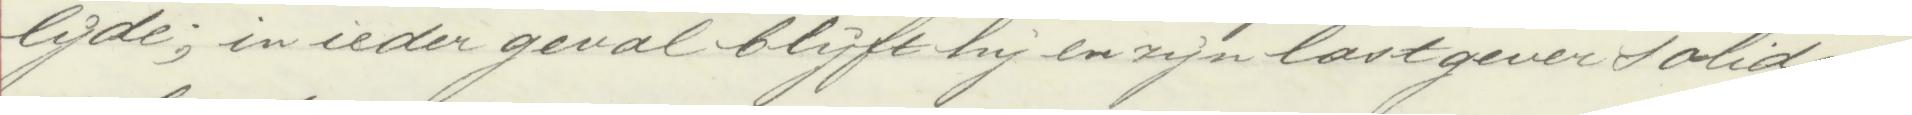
lijde; in ieder geval blijft hij en zijn lastgever solidair
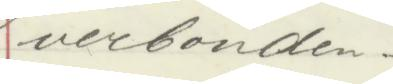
verbonden
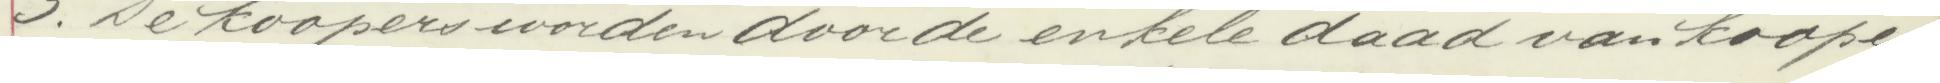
5. De koopers worden door de enkele daad van koopen
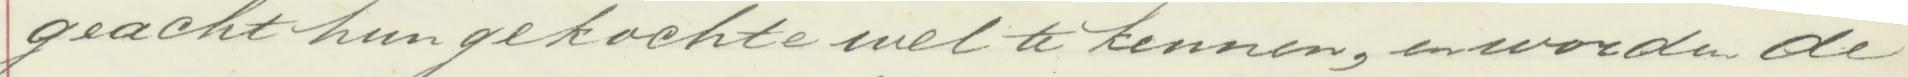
geacht hun gekochte wel te kennen, en worden de
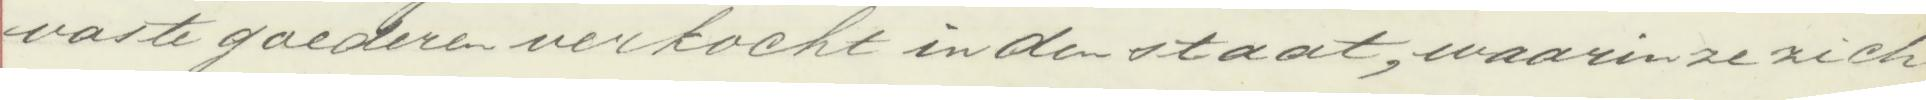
vaste goederen verkocht in den staat, waarin ze zich
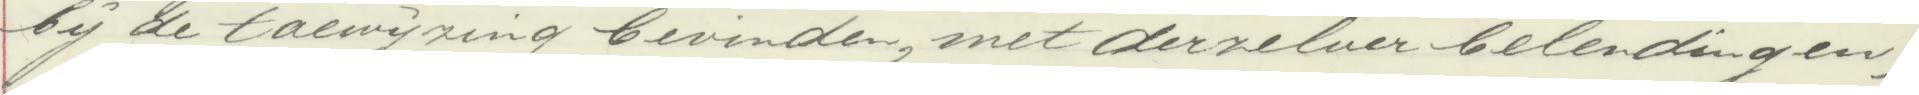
bij de toewijzing bevinden, met derzelver belendingen,
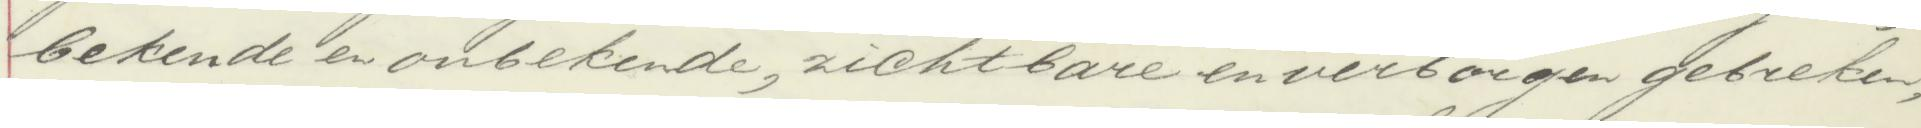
bekende en onbekende, zichtbare en verborgen gebreken
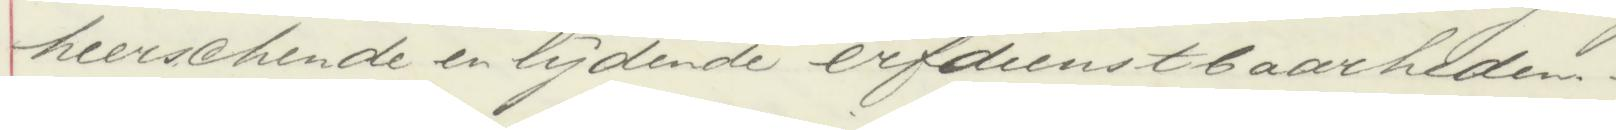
heerschende en lijdende erfdienstbaarheden.
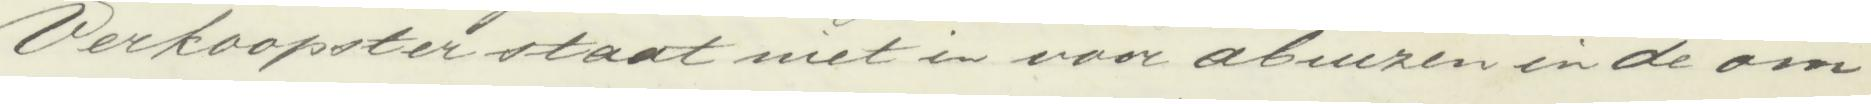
Verkoopster staat niet in voor abuizen in de om
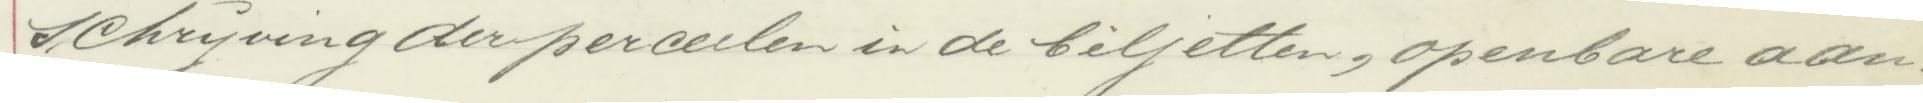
schrijving der perceelen in de biljetten, openbare aan
